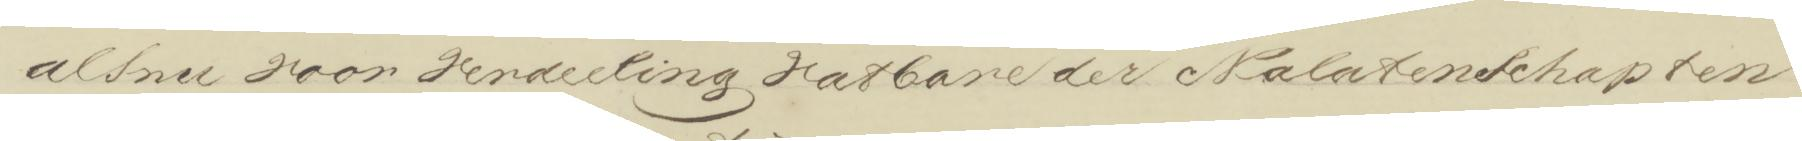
als nu voor verdeeling vatbare der Nalatenschap ten
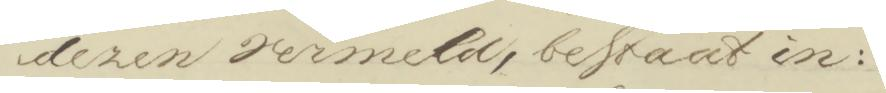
dezen vermeld, bestaat in:
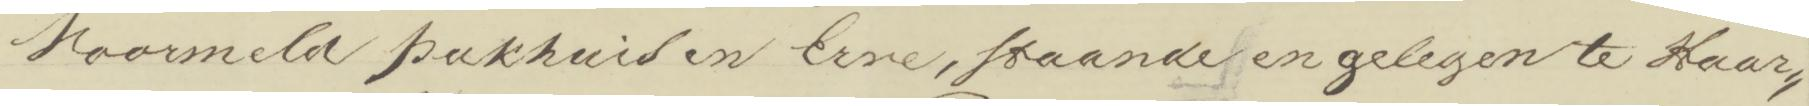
Voormeld pakhuis en Erve, staande en gelegen te Haar„
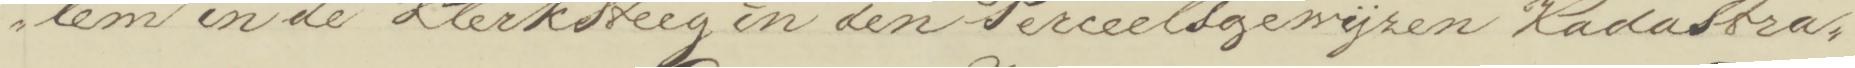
„lem in de Klerksteeg in den Perceelsgewijzen Kadastra„
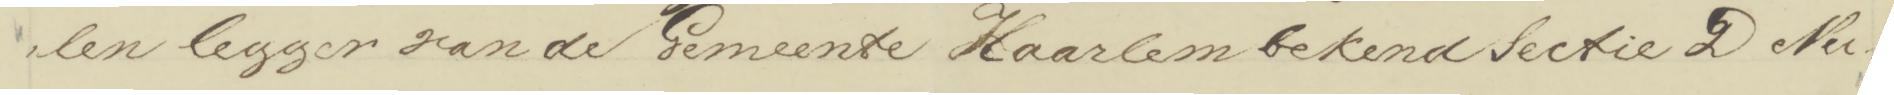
„len legger van de Gemeente Haarlem bekend sectie D Nu„
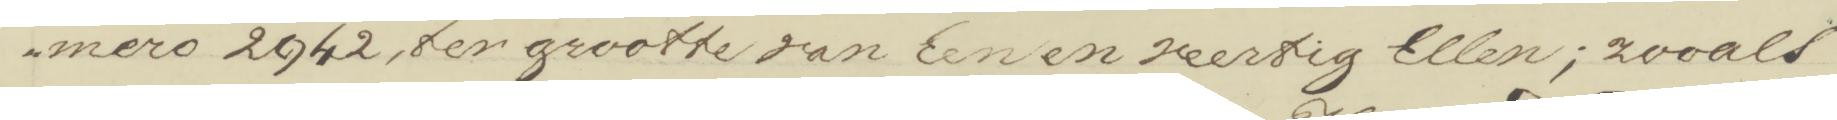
„mero 2942, ter grootte van Een en veertig Ellen; zooals
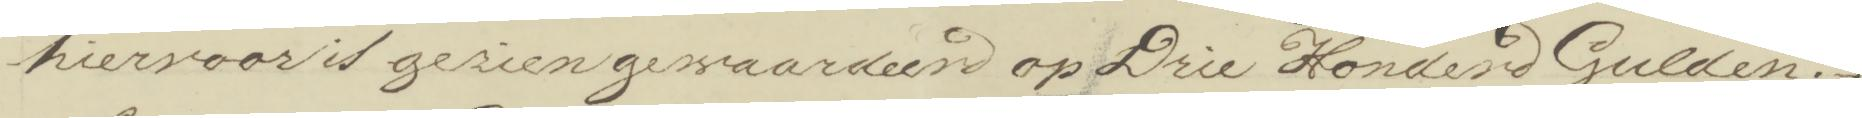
hiervoor is gezien gewaardeerd op Drie Honderd Gulden.
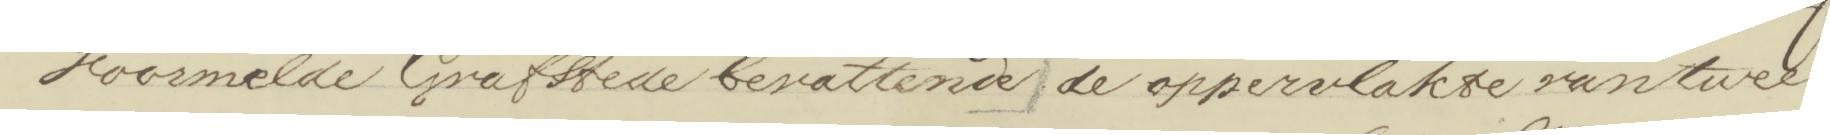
Voormelde Grafstede bevattende de oppervlakte van twee
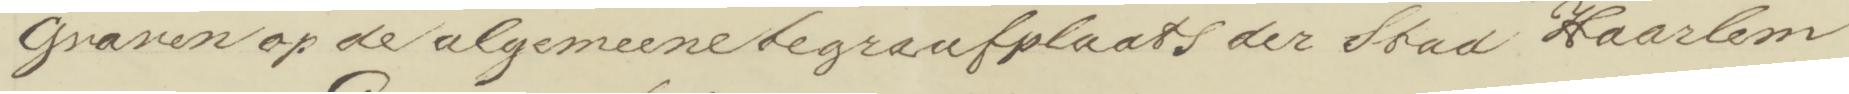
graven op de algemeene begraafplaats der stad Haarlem
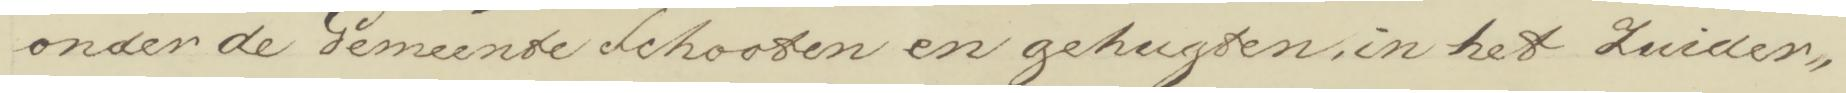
onder de Gemeente Schooten en gehugten, in het Zuider„
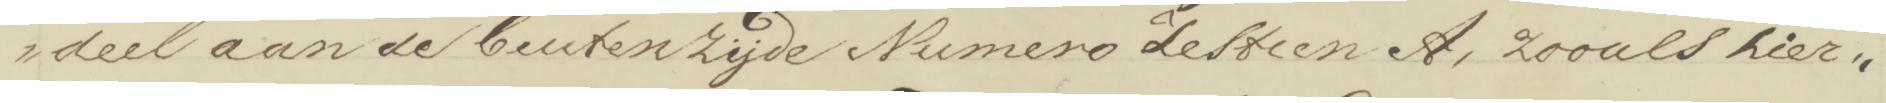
„deel aan de buitenzijde Numero Zestien A, zooals hier„
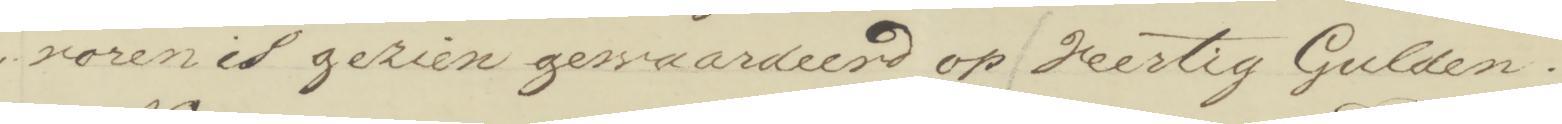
voren is gezien gewaardeerd op Veertig Gulden.
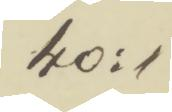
40:1
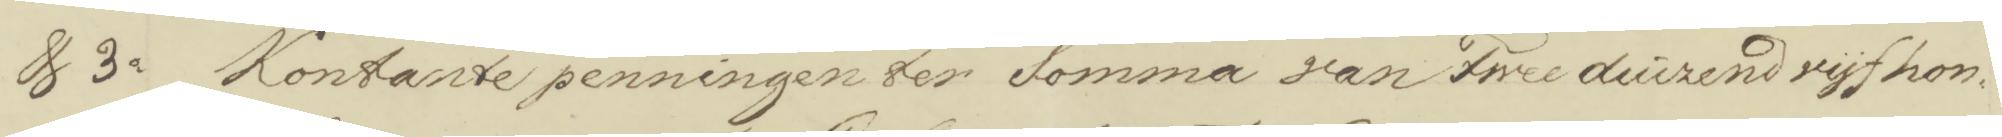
N 3: Kontante penningen ter somma van Twee duizend vijf hon„
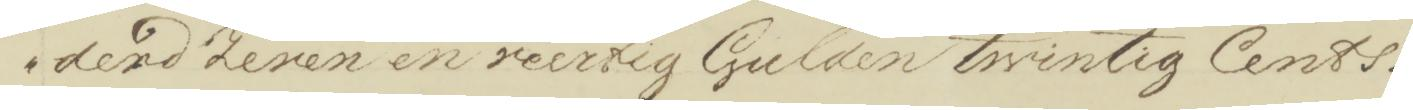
„derd Zeven en veertig Gulden twintig Cents.
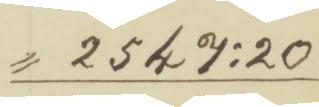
„ 2547:20
